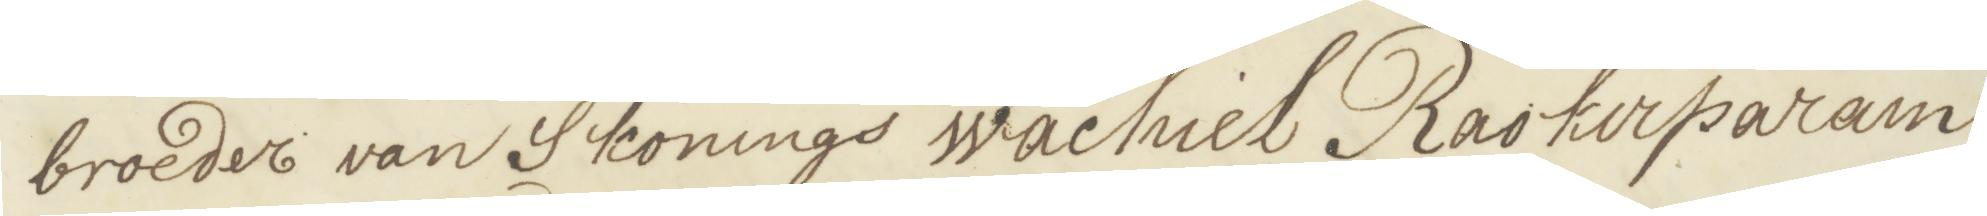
broeder van s konings wachiel Raskirparam
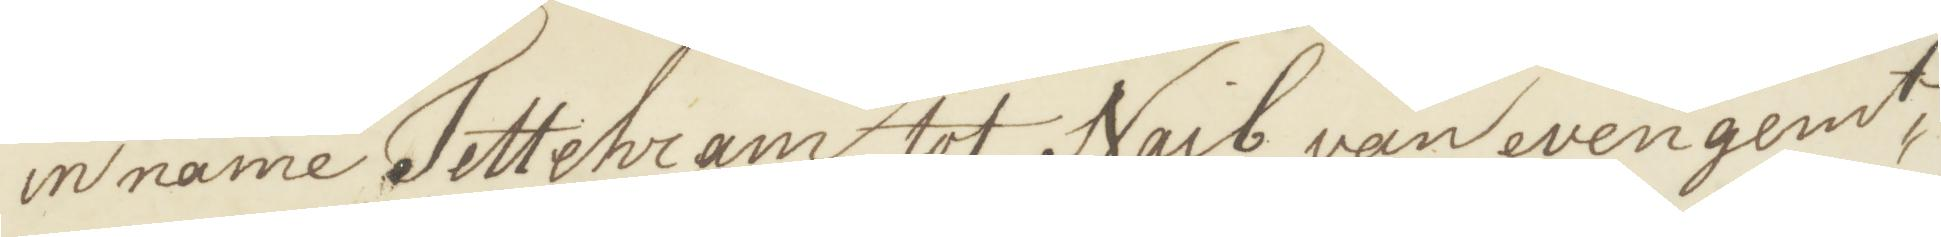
in name Tettehram tot Naib van evengem„te
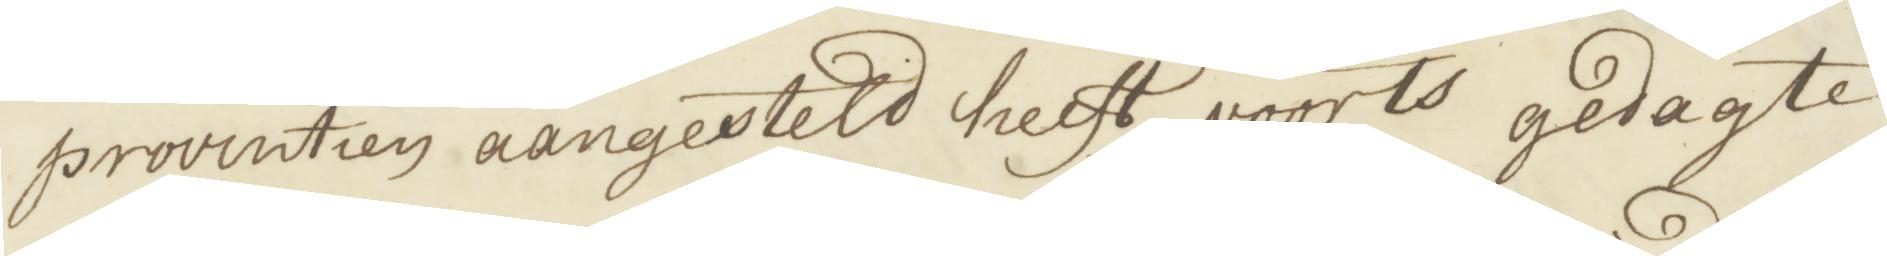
provintien aangesteld heeft voorts gedagte
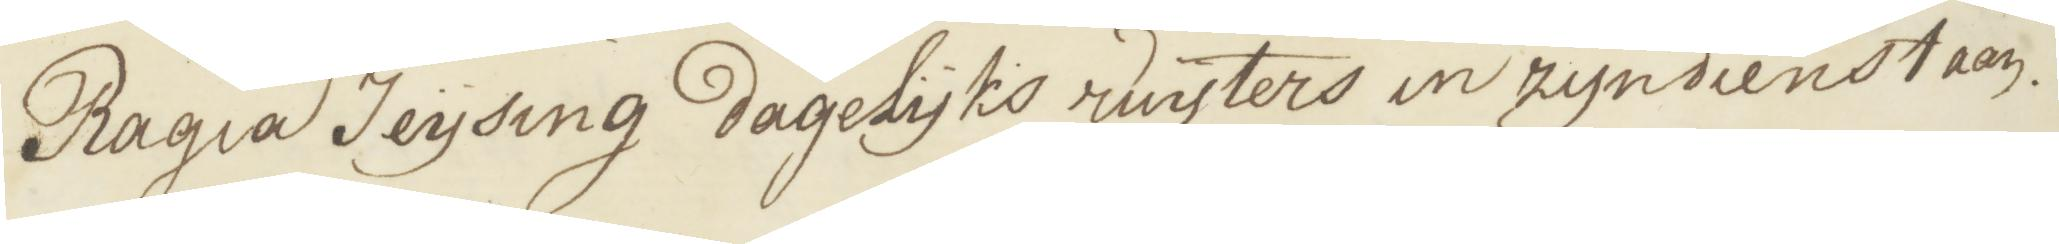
Ragia Ieijsing dagelijks ruijters in zijn dienst aan.
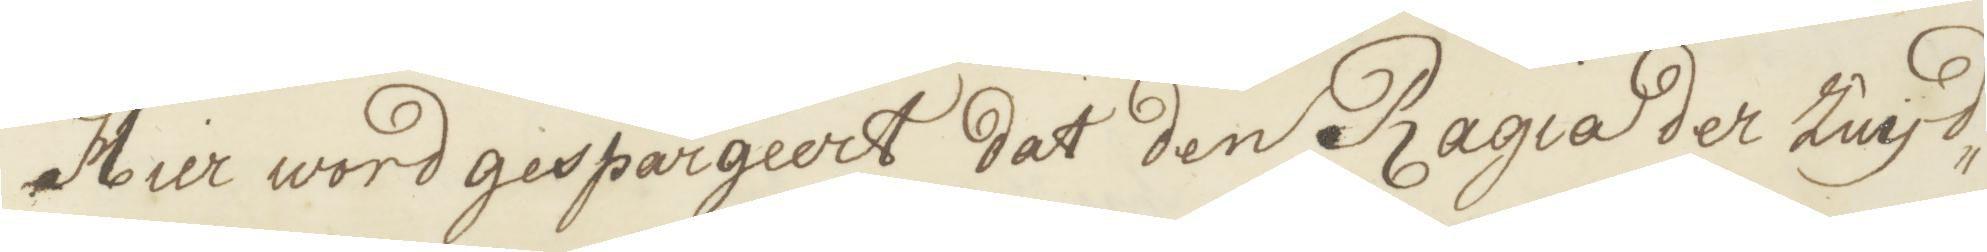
Hier word gespargeert dat den Ragia der zuijd„
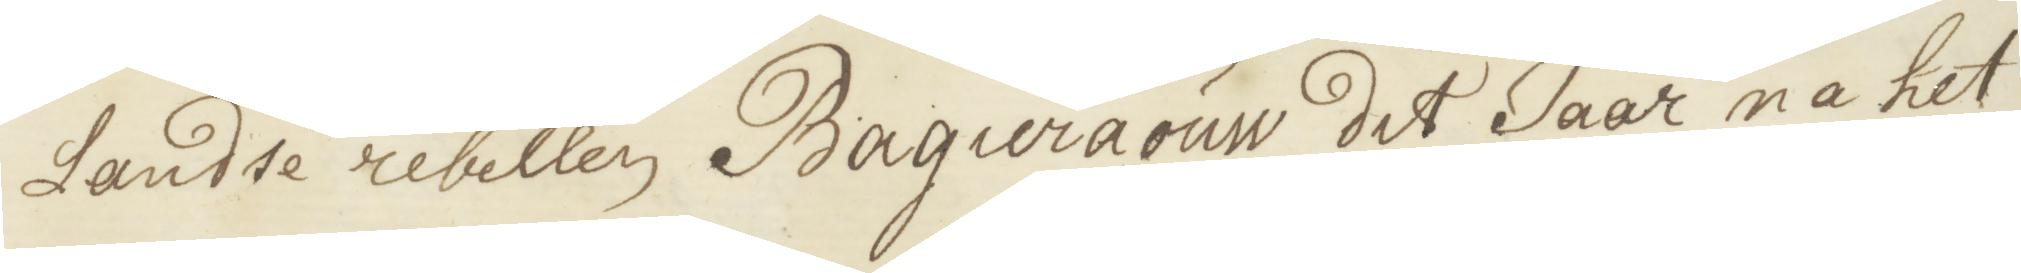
Landse rebellen Bagieraouw dit Iaar na het
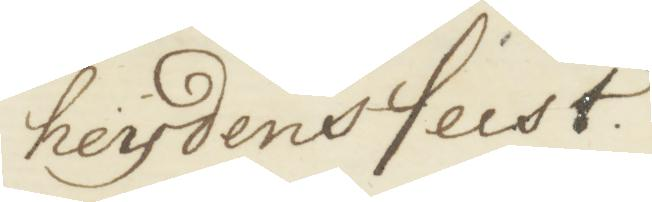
heijdens feest.
